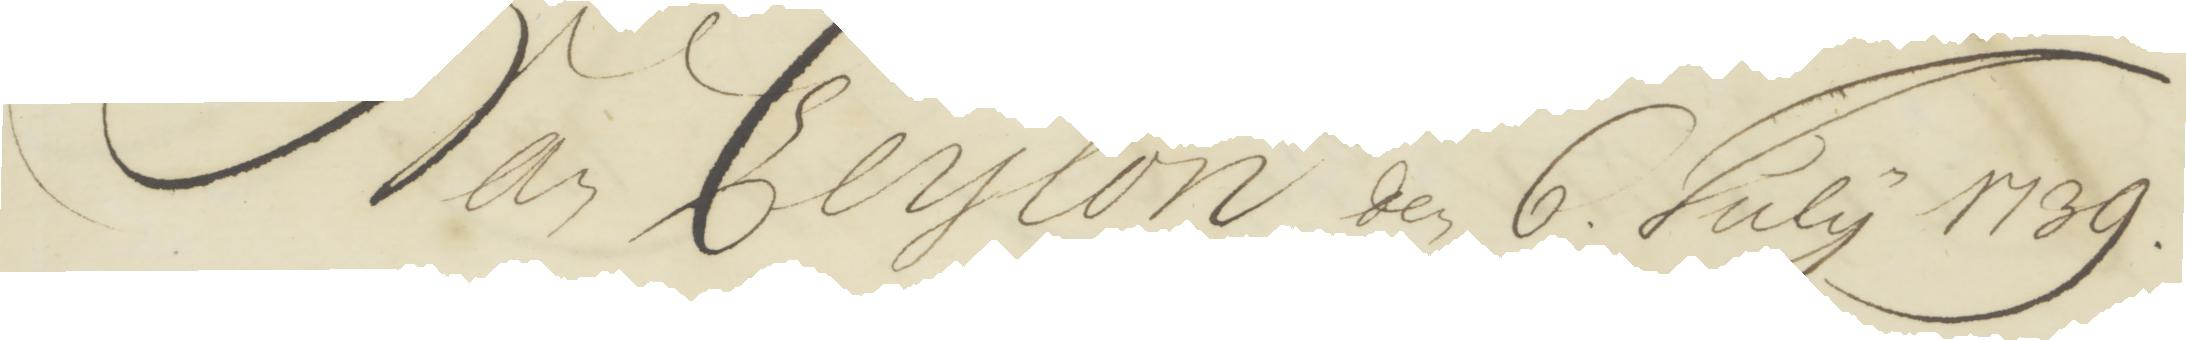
Van Cejilon den 6: Julij 1739.
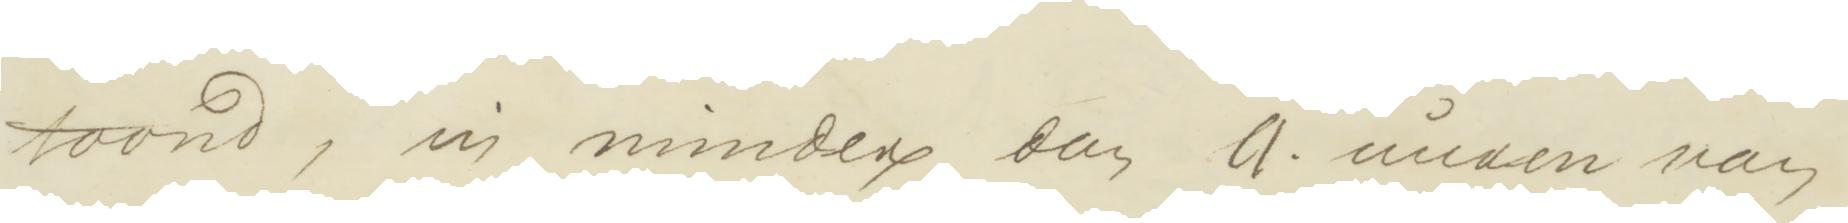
toond, in minder dan 4. uuren van
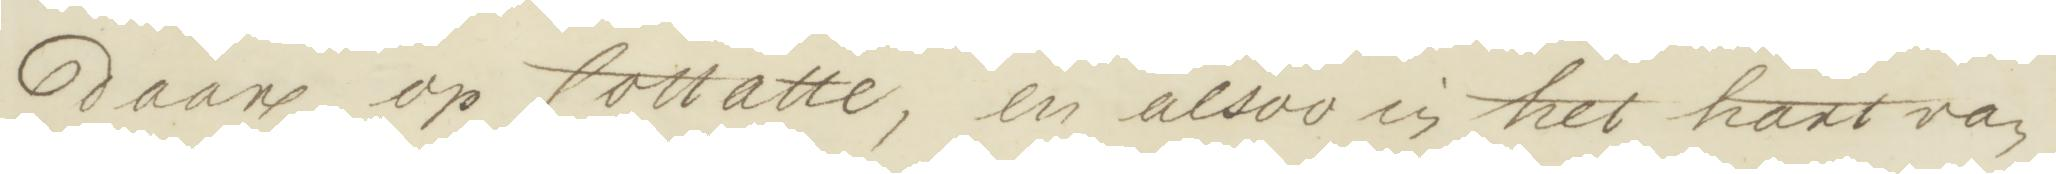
daar op Cottatte, en alsoo in het hart van
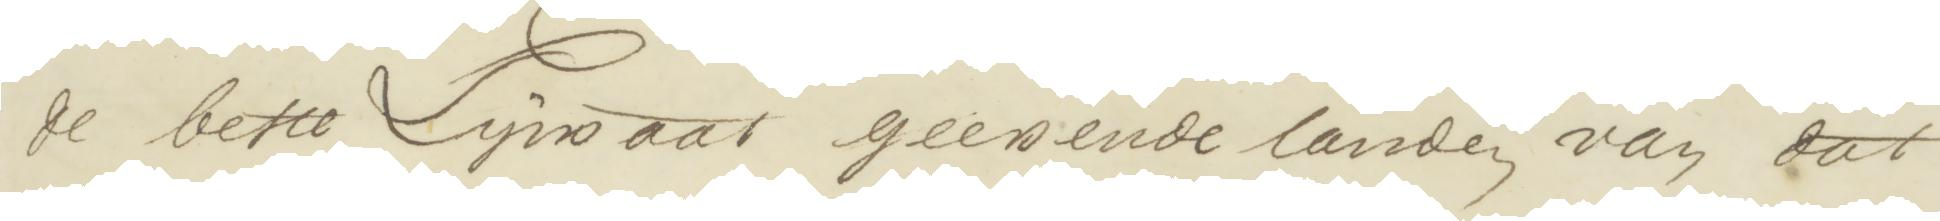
de beste Lijwaat geevende landen van dat
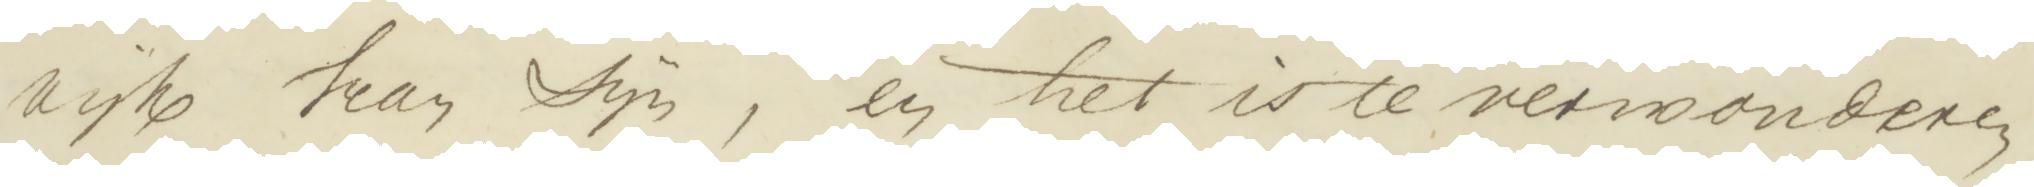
rijk kan sijn, en het is te verwonderen,
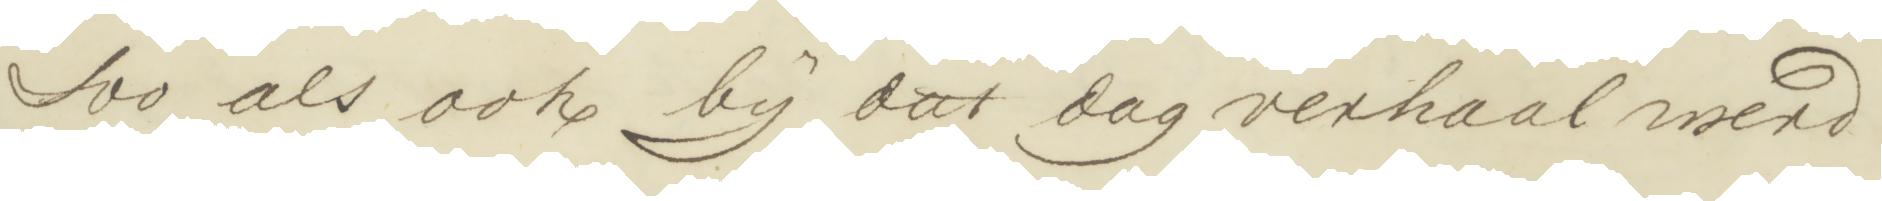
soo als ook bij dat dag verhaal werd
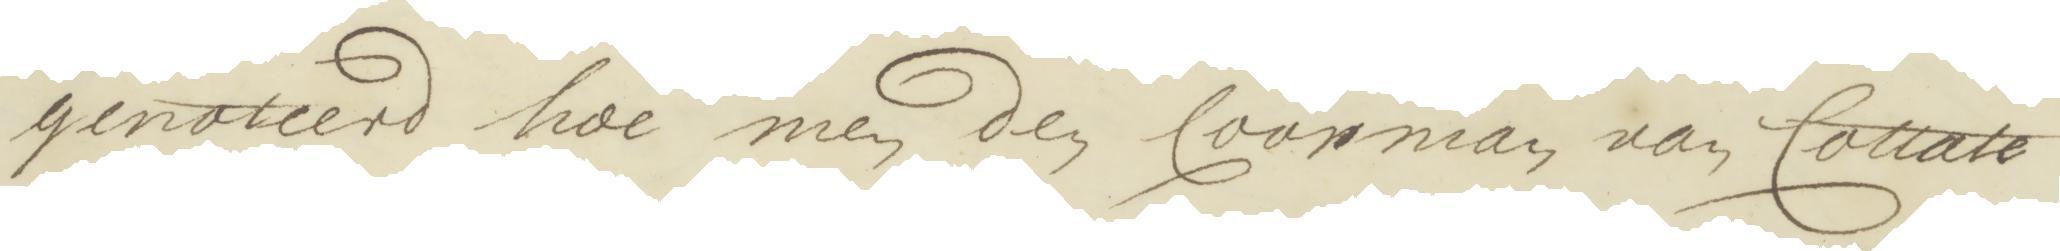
genoteerd hoe men den Coopman van Cottate
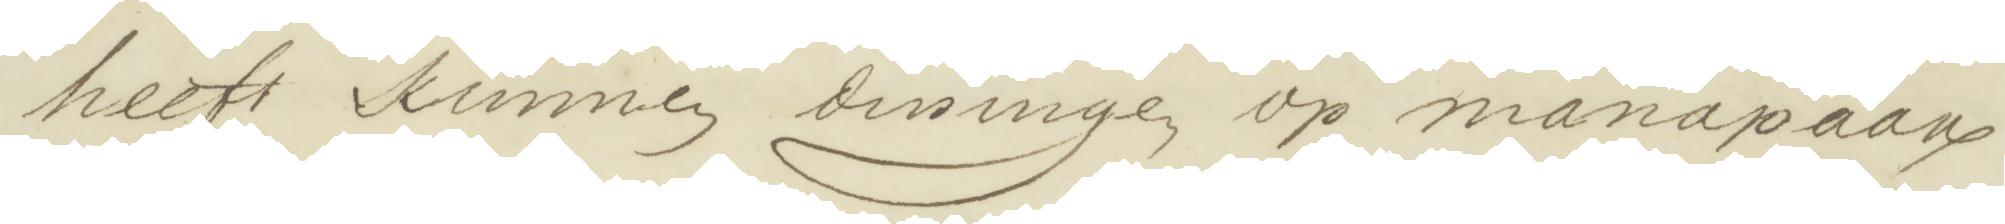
heeft kunnen diningen op manapaar
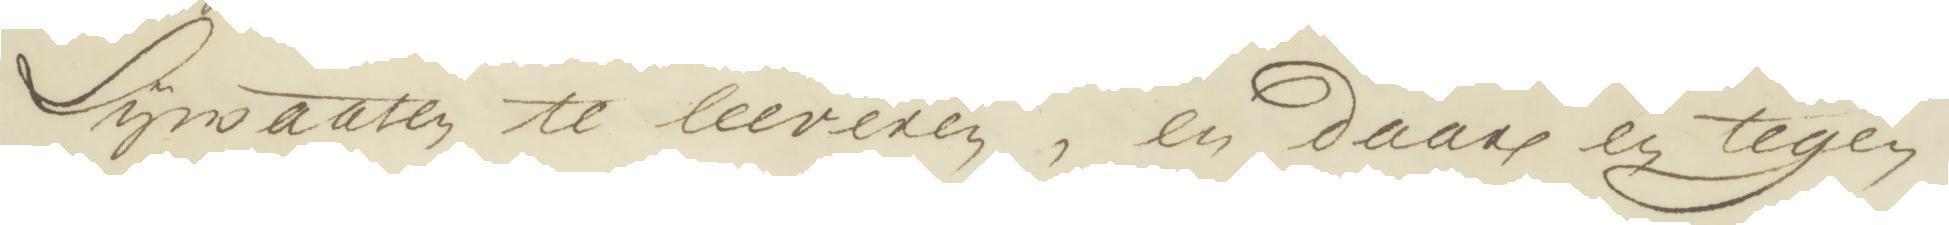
Lijwaaten te leeveren, en daar en tegen
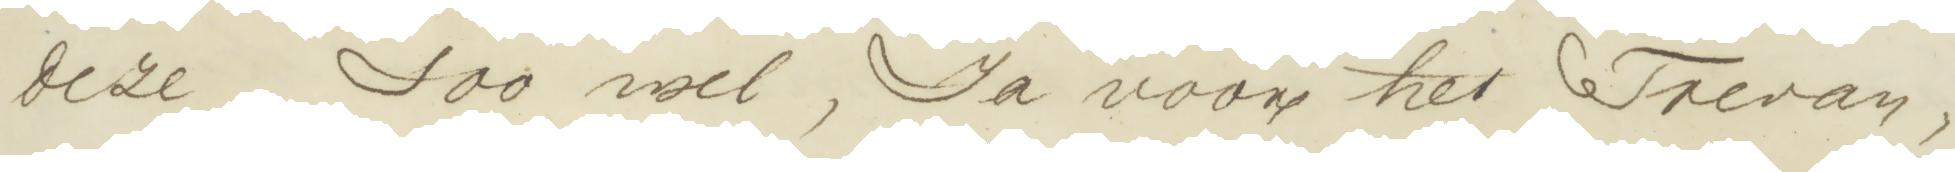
deze, soo wel, Ja voor het Trevan„
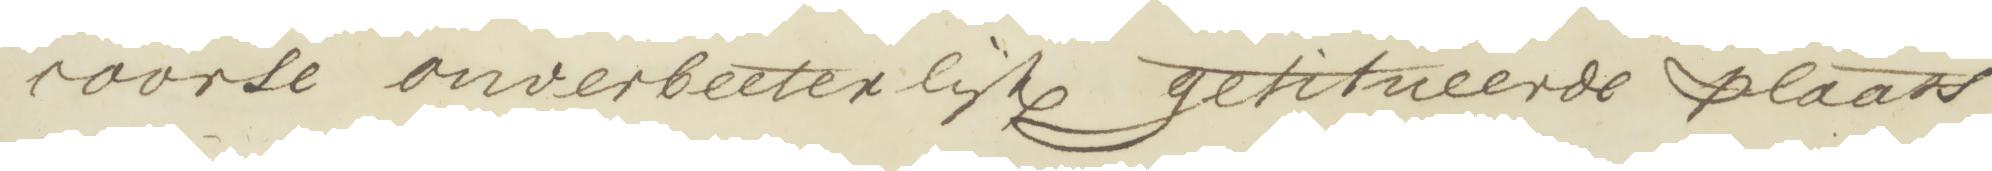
coorse onverbeeter lijk getitueerde plaats
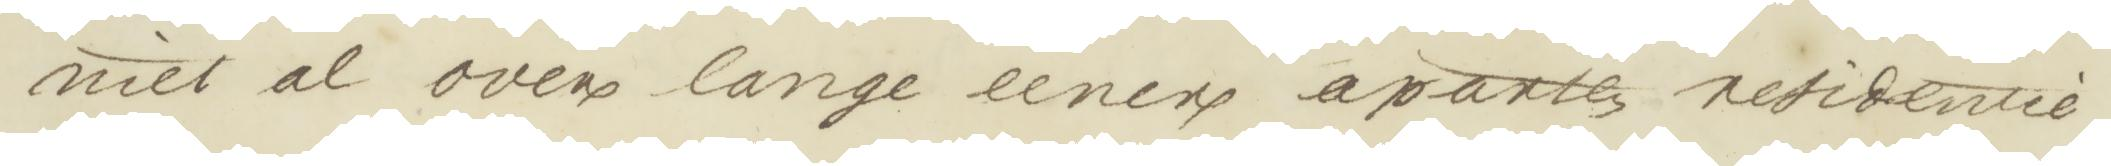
niet al over lange eener aparten residentie
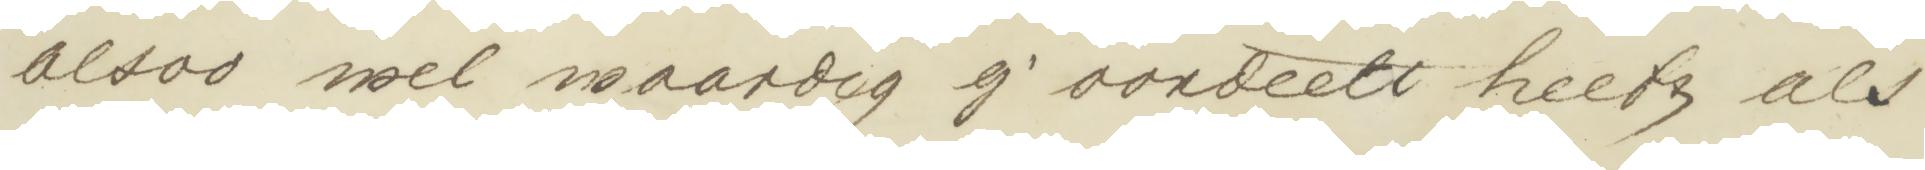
alsoo wel waardig g’ oordeelt heeft als
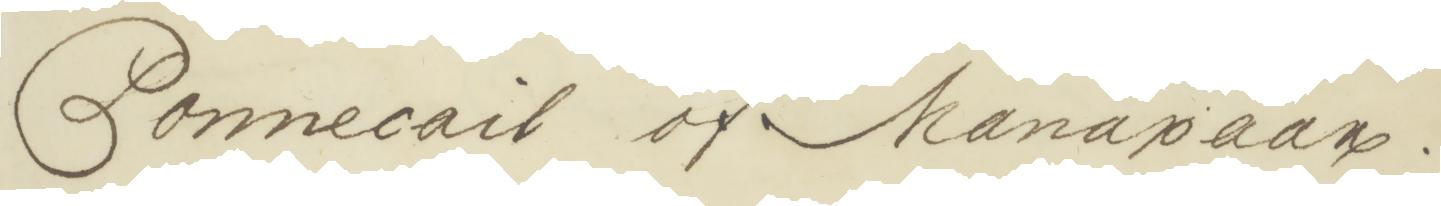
Ponnecais of Manapaar.
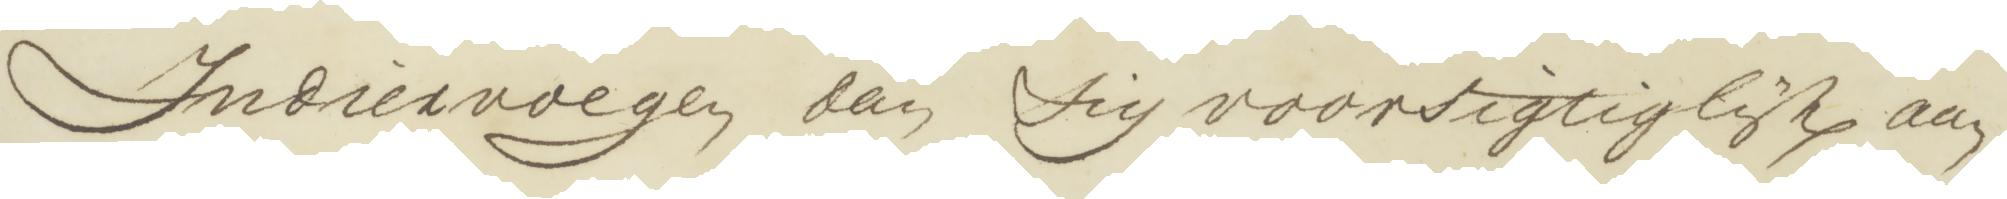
Indiervoegen dan sig voorsigtiglijk aan
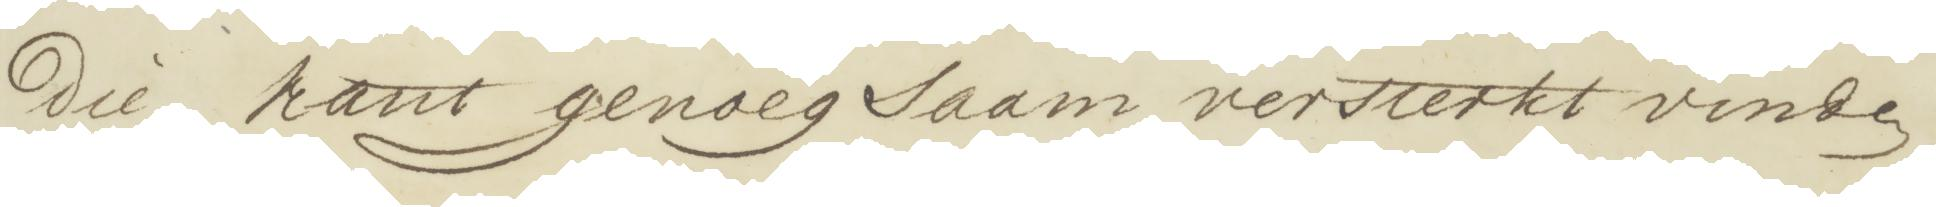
die kant genoegsaam versterkt vinden
